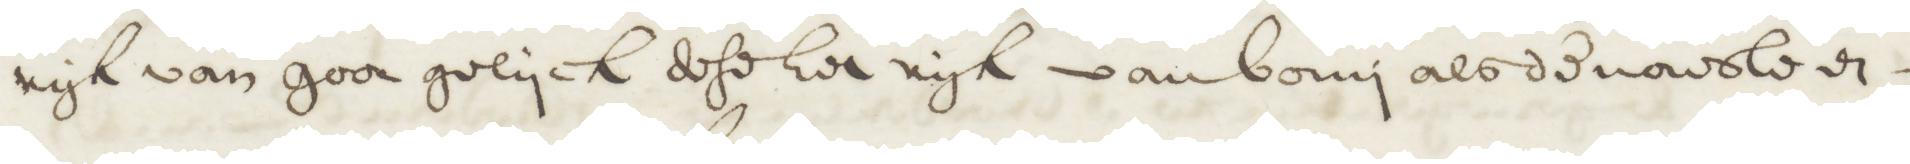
rijk van goor gelijck dese het rijk van bonij als de naeste en
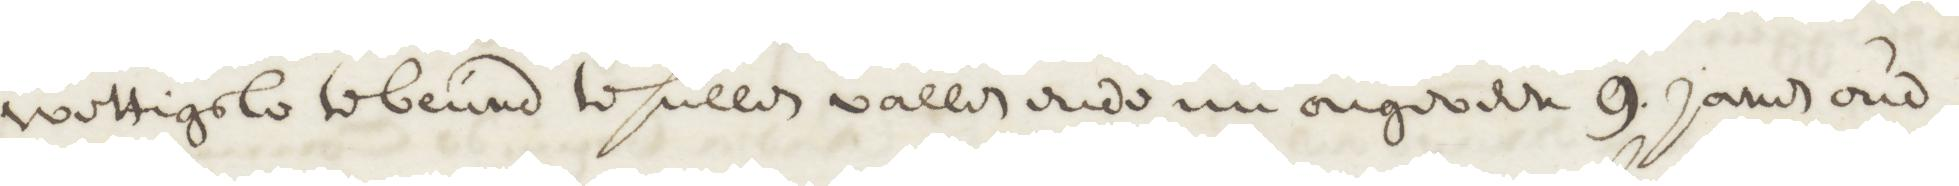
wettigste te beurd te sullen vallen ende nu ongeveer 9. jaren oud
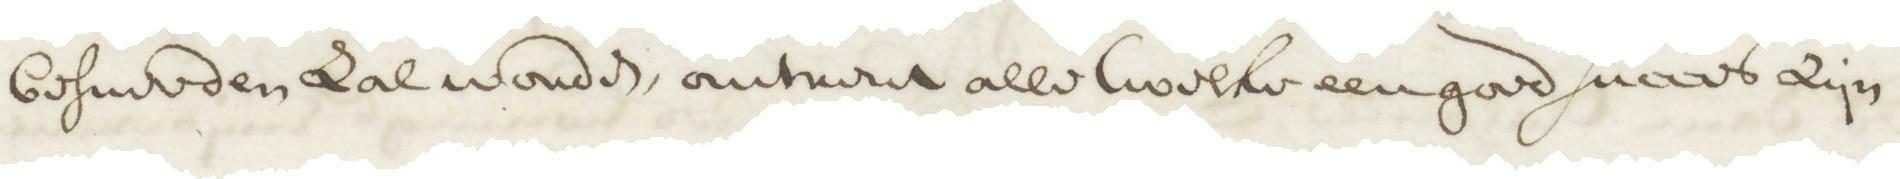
besneeden Zal worden, omtrent alle 'twelke een goed Succes zijn
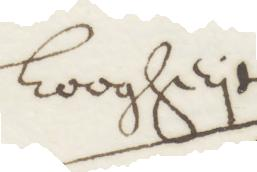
hoogheijd
